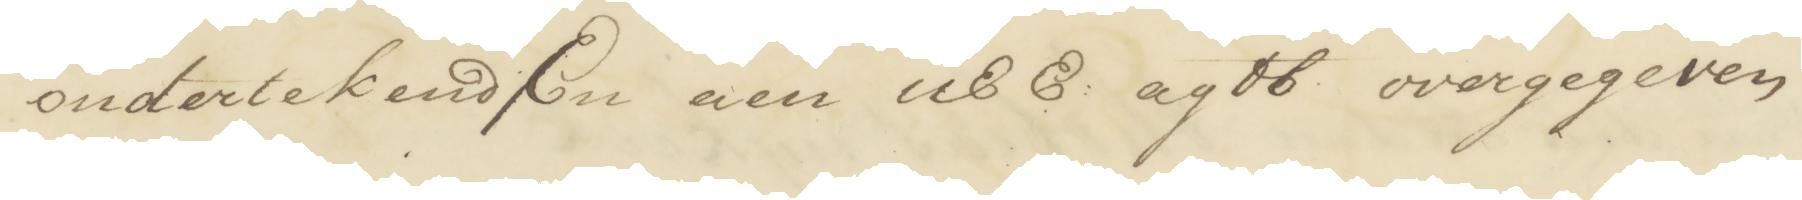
ondertekend /En aen UE E: agtb: overgegeven
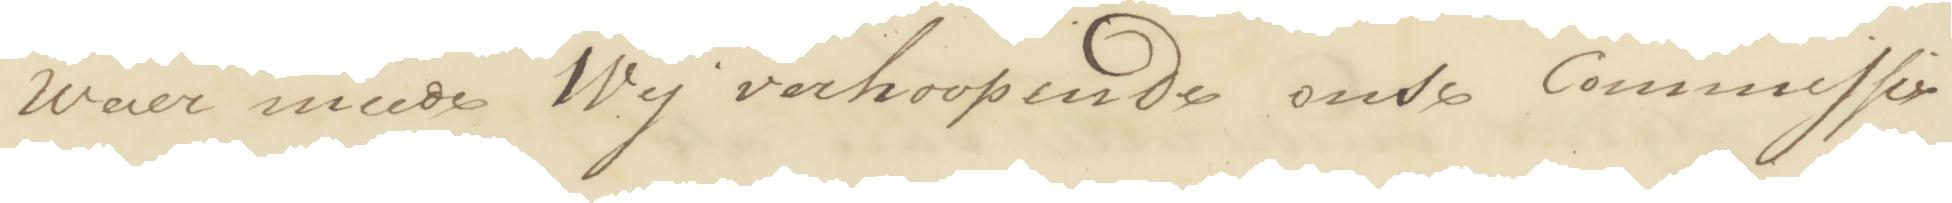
waer meede Wy verhoopende onse Commissie
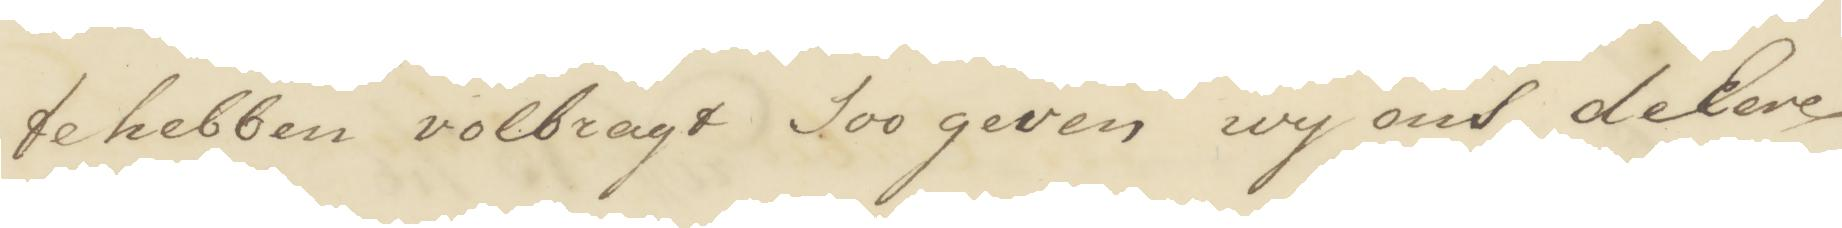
te hebben volbragt soo geven wy ons deEere
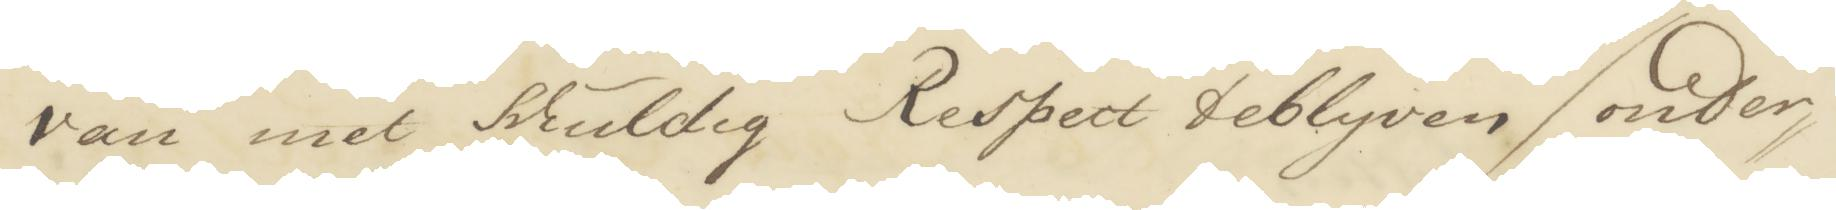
van met schuldig Respect teblyven /onder„
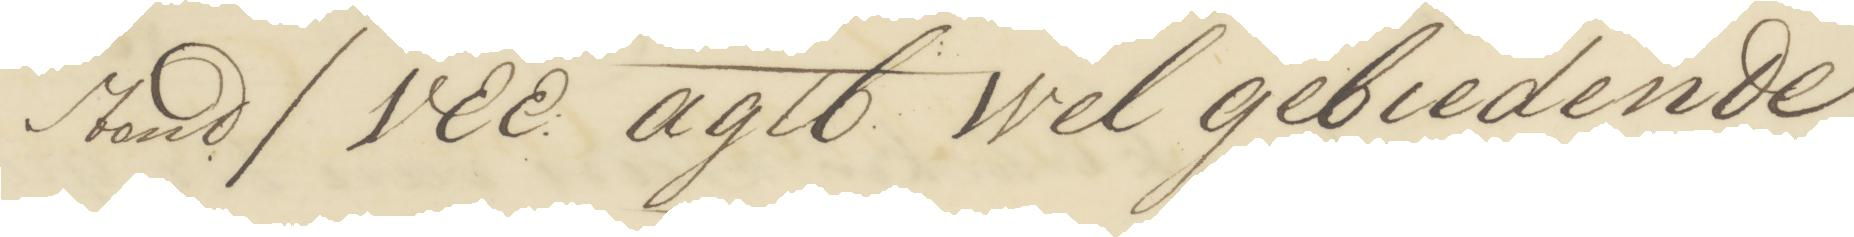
stond/ VE E: agtb: wel gebiedende
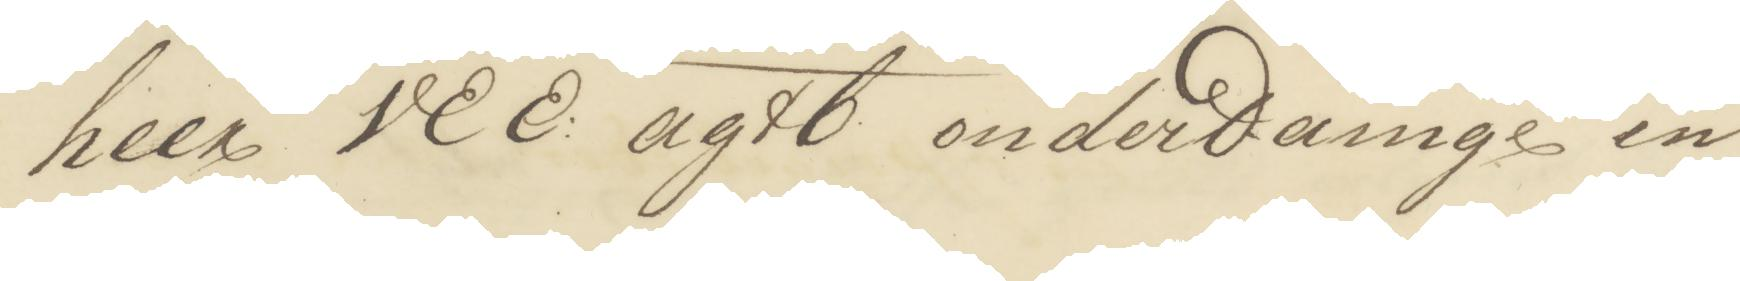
heer VE E: agtb: onderdanige en
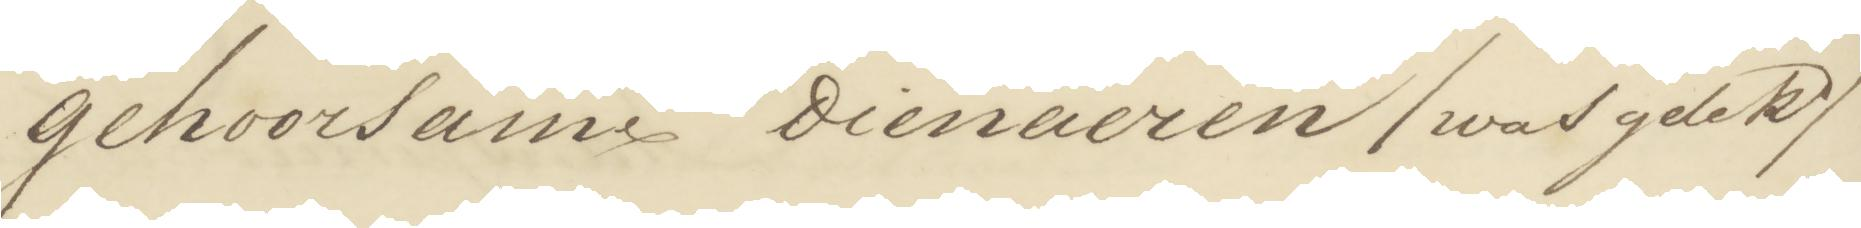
gehoorsame dienaeren /was getekt/
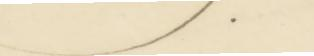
J.
